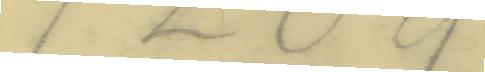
1209
